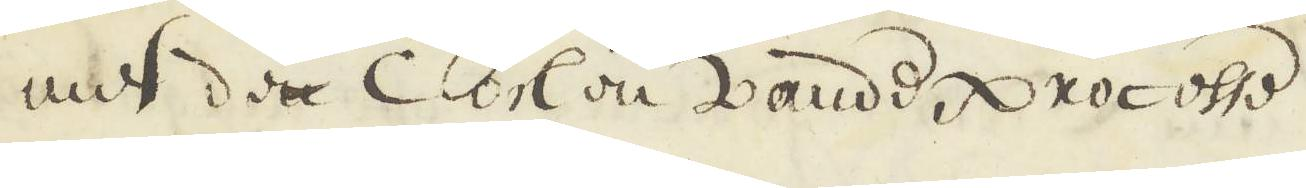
met den Costen vande processe
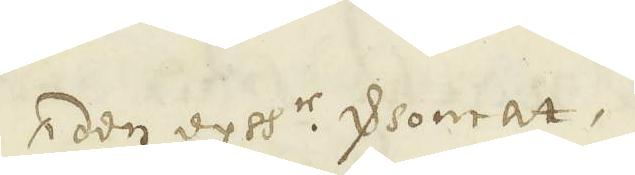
^ den eyss.r versorcht,
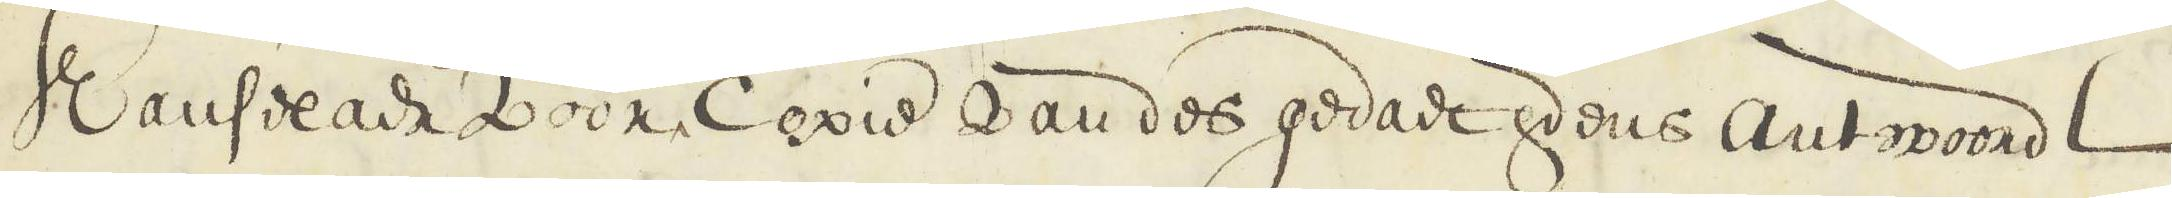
Kanselaer voor ^ Copie van des gedaechdens Antwoordt
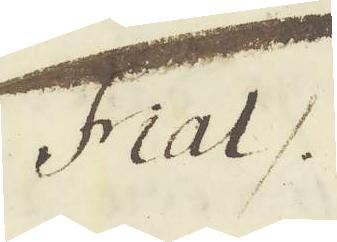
Fiat /.
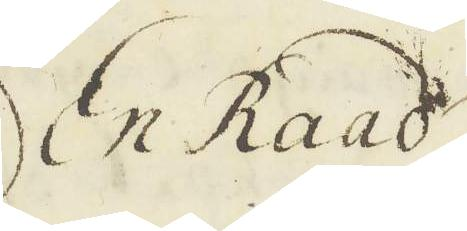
En Raad
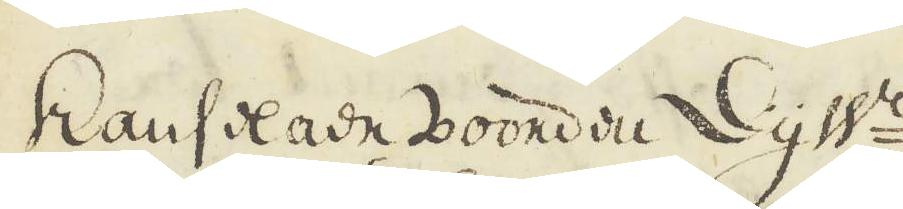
kanselaer voorden Eijss=r
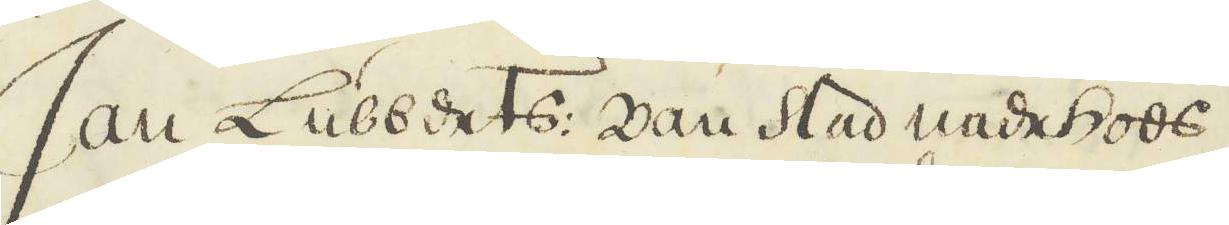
Jan Lubberts: van stad naerhoes
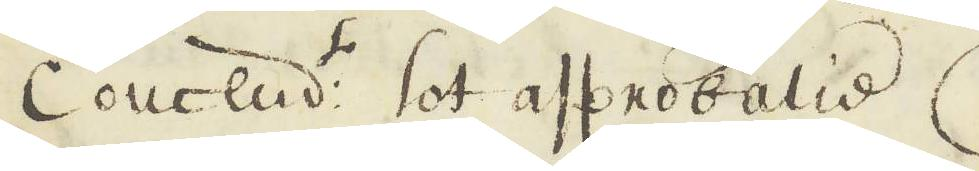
Conclud:t tot approbatie
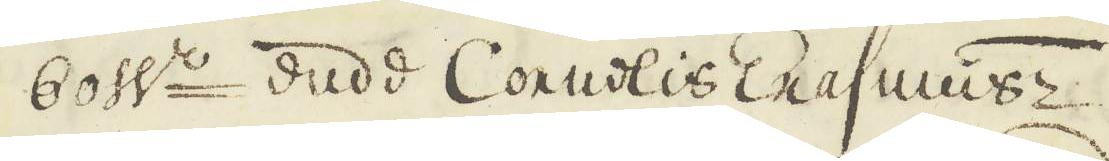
boss=r ende Cornelis Erasmusz
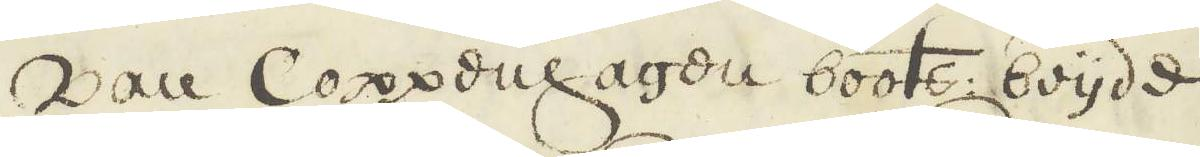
van Coppenhagen boots: beijde
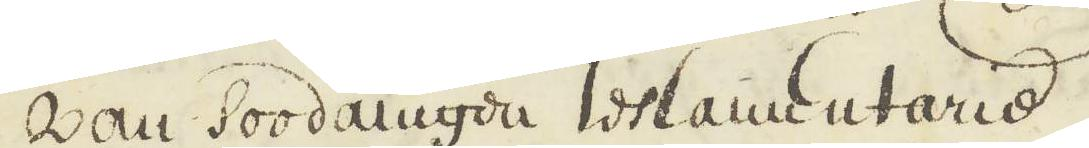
van soodanigen testamentarie
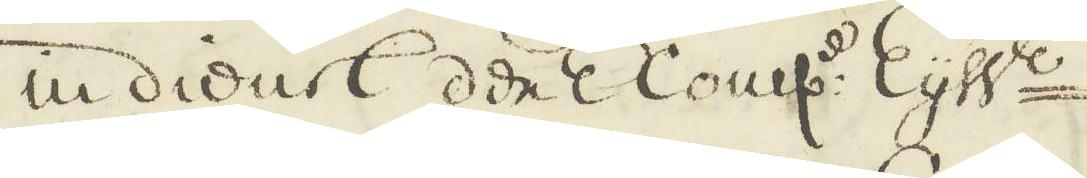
in dienst der E Comp:e Eijss=r
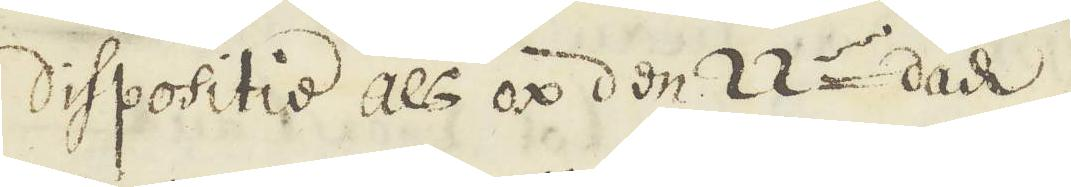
dispositie als op den 22=e daer
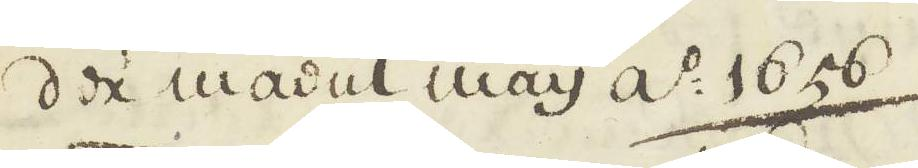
der maent maij a:o 1656
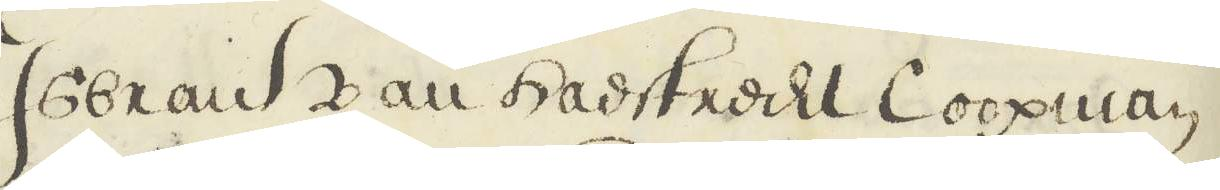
Jsbrant van haestrecht Coopman
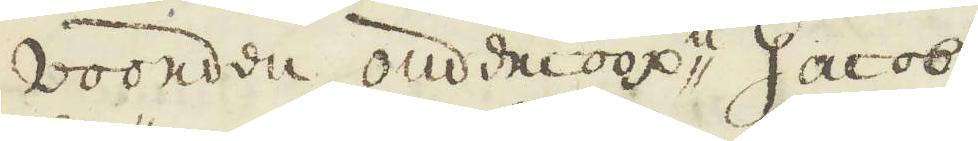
voorden ondercoop„n Jacob
